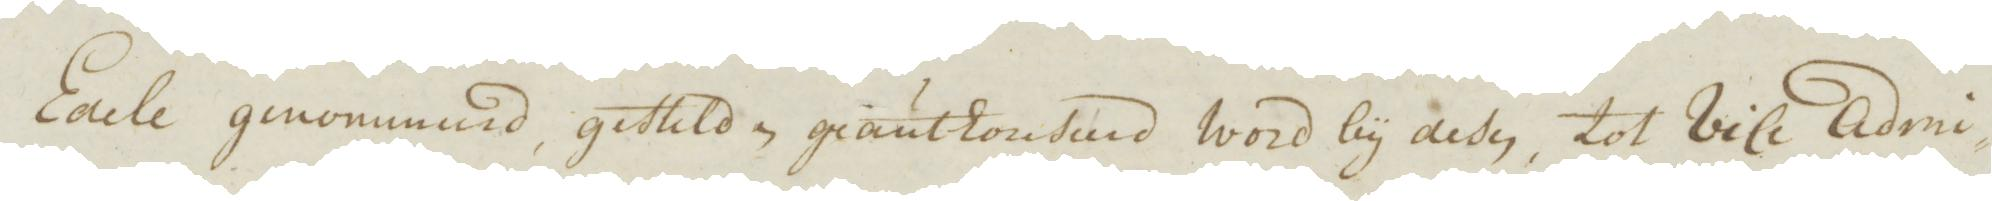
Edele genomineerd, gesteld en geauthoriseerd word bij desen, tot vice Admi„
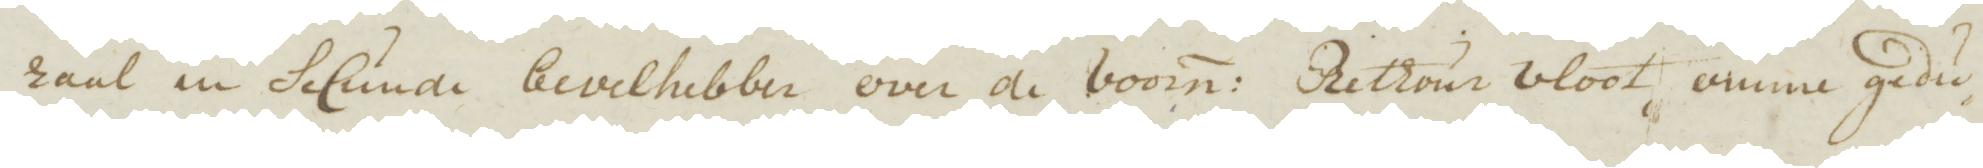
raal en secunde bevelhebber over de voorn: Rethour vloot, omme gedu„
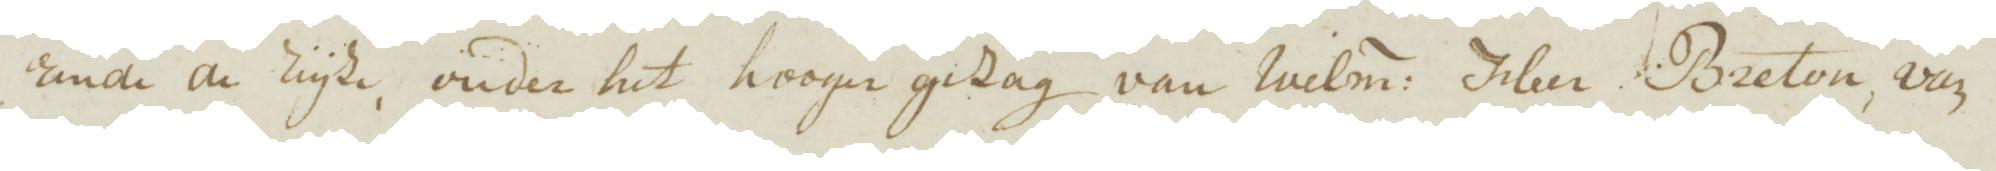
rende de rijze, onder het hooger gezag van Wilm: Heer Breton, van
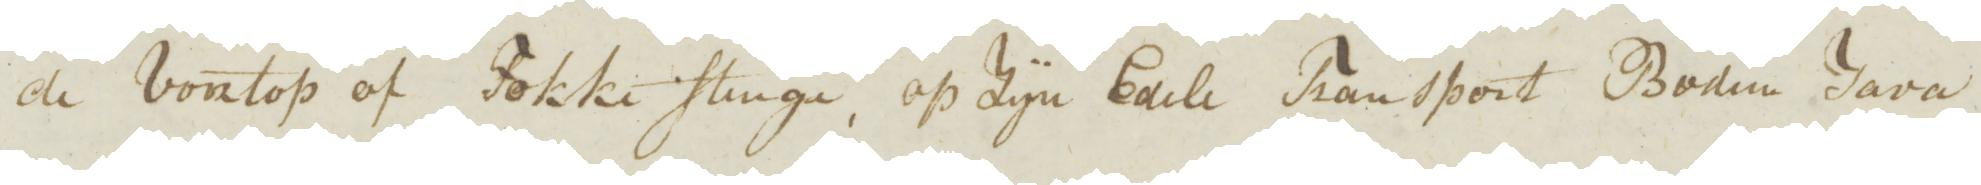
de Voortop of Fokke stenge, op Zijn Edele Transport Bodun Iava
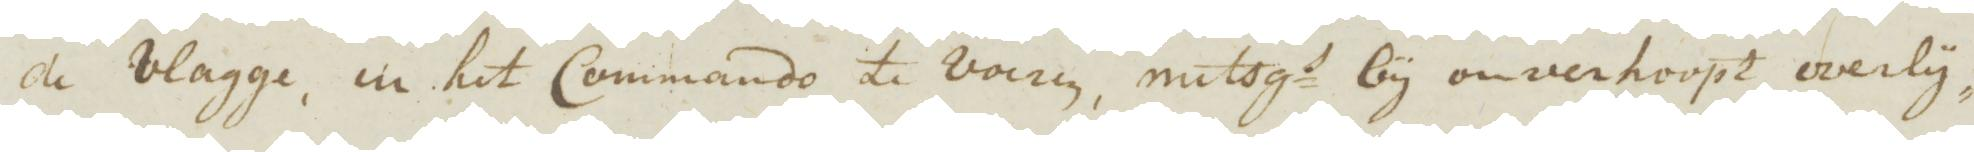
en vlagge, in het commando te voeren, mitsg:s bij onverhoopt overlij„
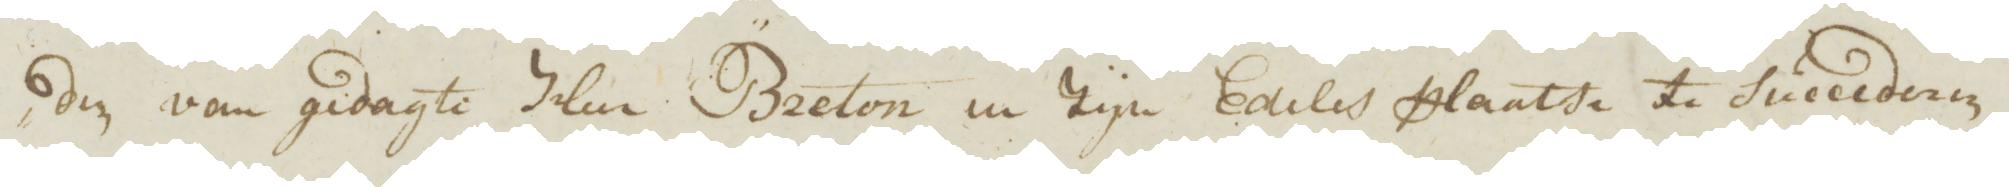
„den van gedagte Heer Breton in zijn Edeles plaatse te succederen
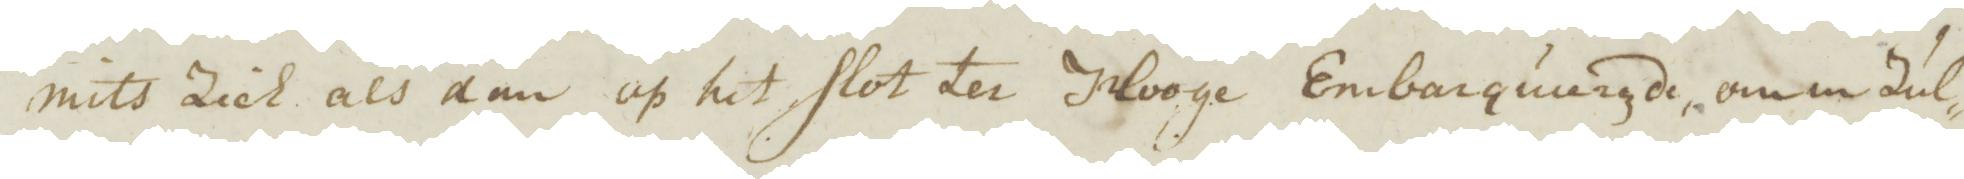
mits zich als dan op het slot ter Hooge Embarqueerende, om in zul„
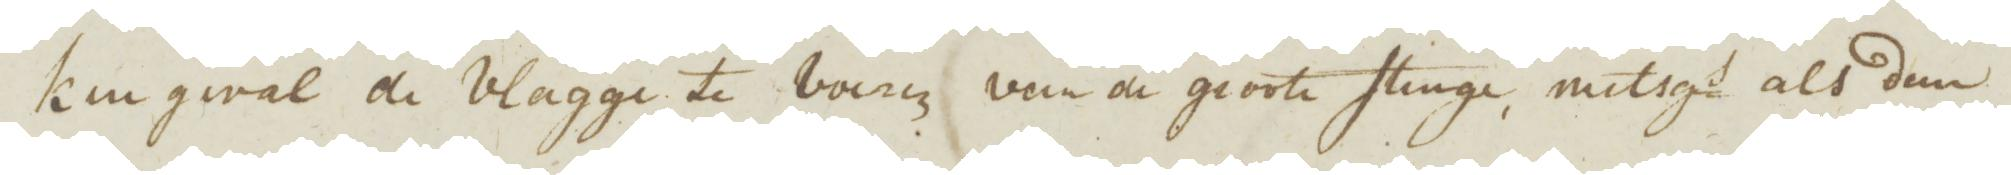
ken geval de vlagge te voeren van de groote stenge, mitsg:s als dan
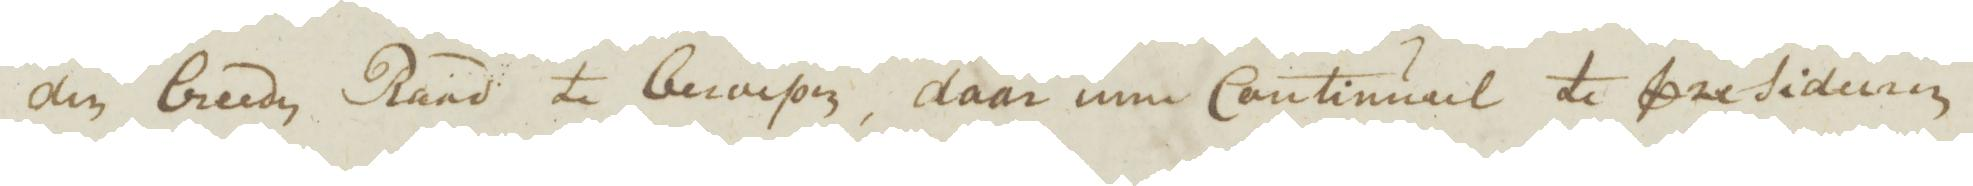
den breeden Raad te beroepen, daar inne Continueel te presideeren
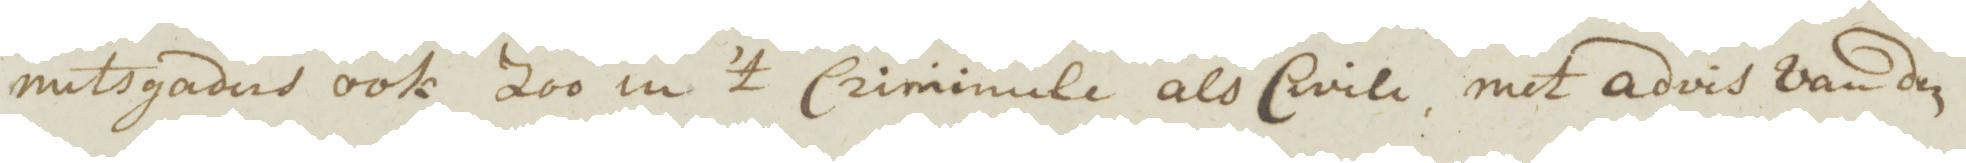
mitsgaders ook, zoo in ’t crimineele als civile met advis van den
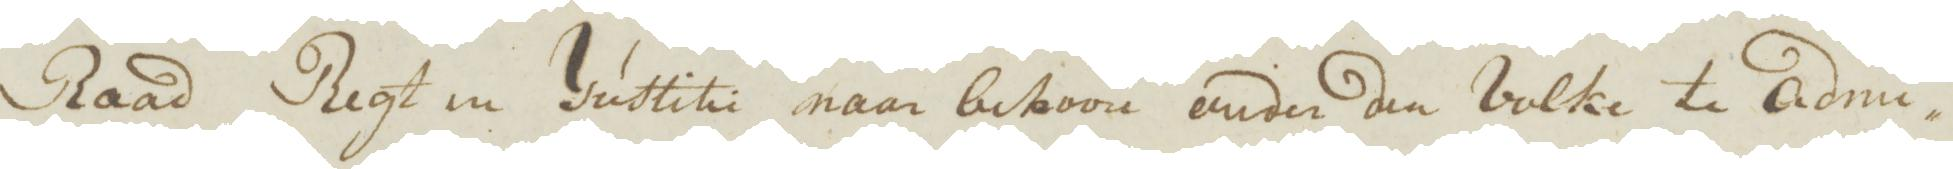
Raad Regt in Iustitie naar bekoore onder den volke te admi„
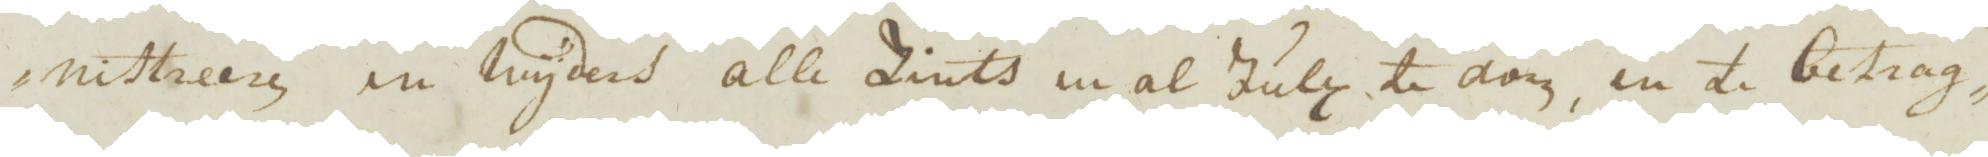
„nistreeren en wijders alle zints en al zulx te doen, en te betrag„
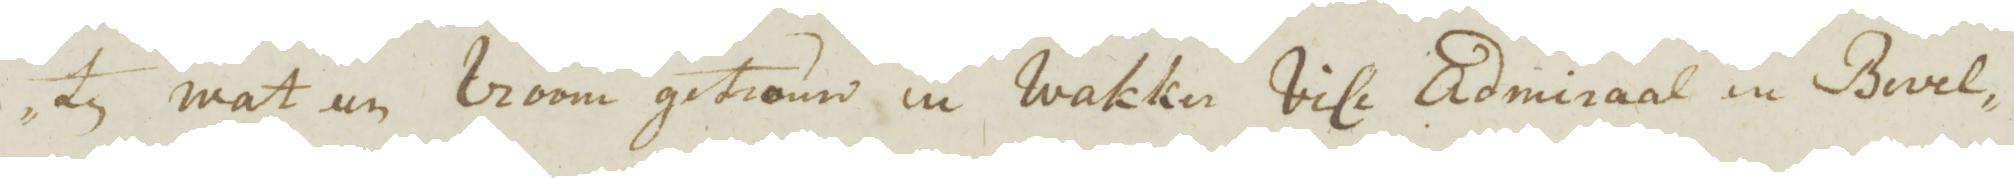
„ten wat een vroom getrouw en wakker vice Admiraal en Bevel„
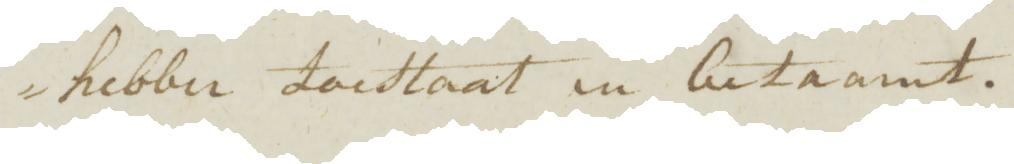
hebber toestaat en betaamt.
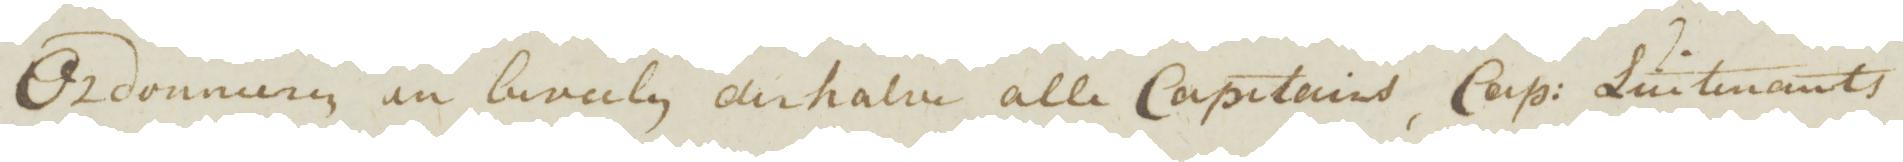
Ordonneeren en beveelen derhalve alle Capitains, Cap: Luitenants
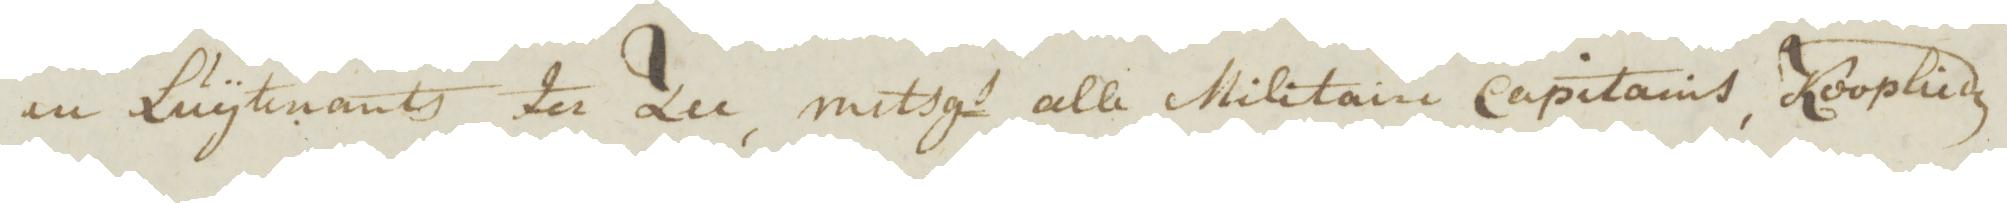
en Luijtenants ter Zee, mitsg-s alle Militaire Capitains, Kooplieden
